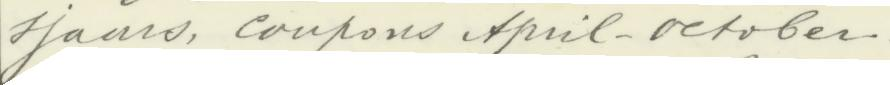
sjaars, coupons April - October
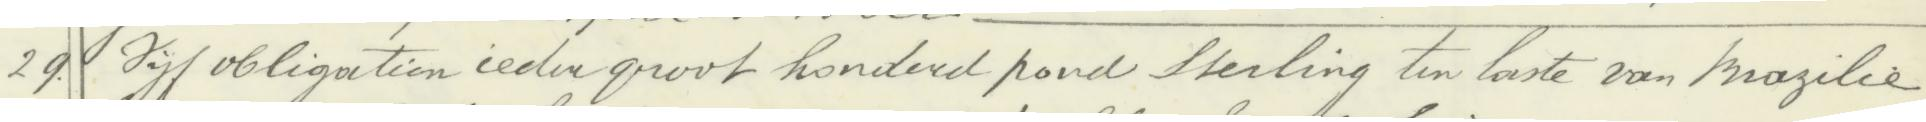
29. Vijf obligatien ieder groot honderd pond Sterling ten laste van Brazilie
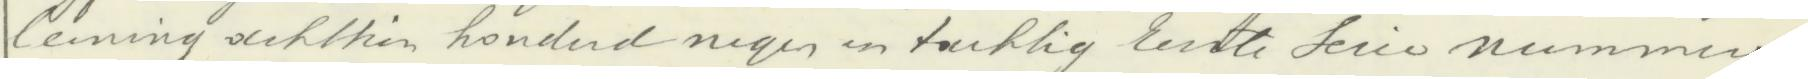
leening achttien honderd negen en tachtig Eerste serie nummers
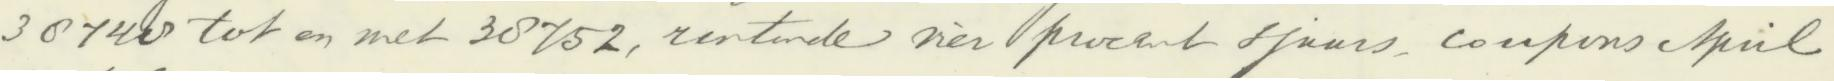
38748 tot en met 38752, rentende vier procent sjaars, coupons April
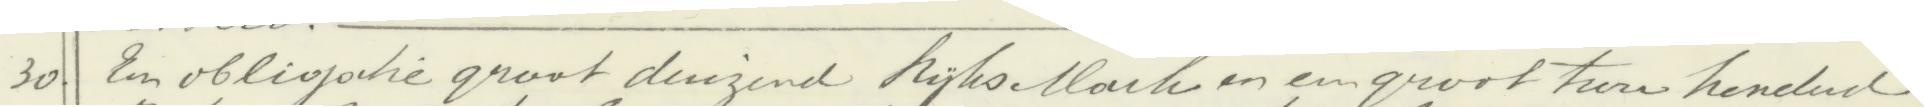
30. Een obligatie groot duizend Rijks Mark en een groot twee honderd
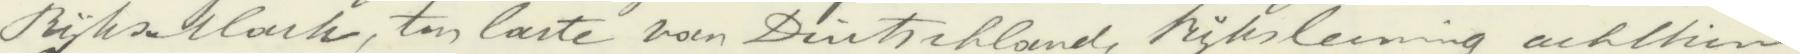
Rijks Mark, ten laste van Duitschland, Rijksleening achttien
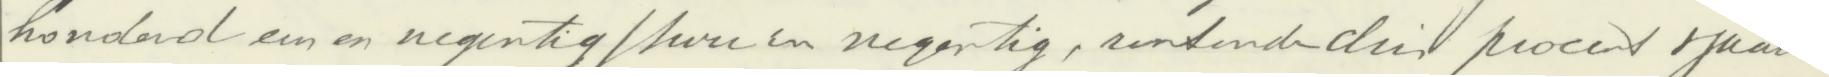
honderd een en negentig / twee en negentig, rentende dus procent sjaars
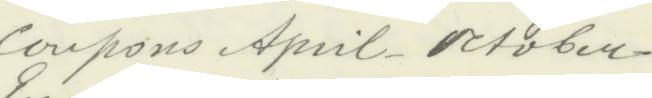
coupons April - October
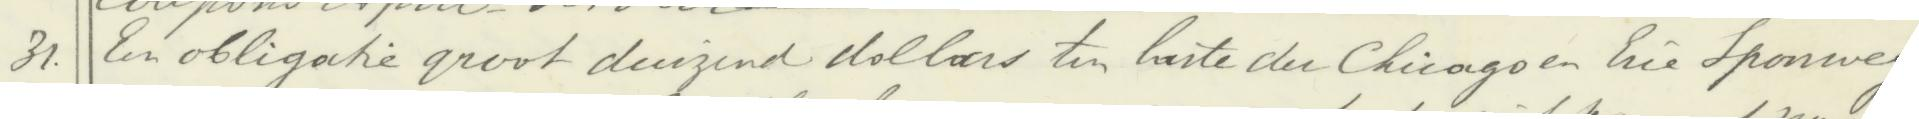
31. Een obligatie groot duizend dollars ten laste der Chicago en hie Spoorweg
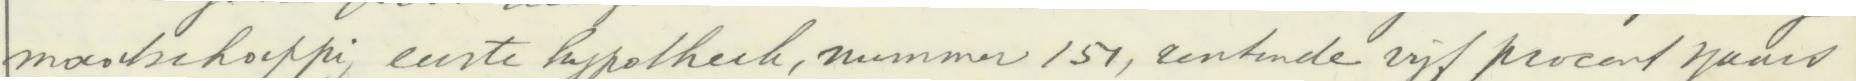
maatschappij eerste hypotheek, nummer 151, rentende vijf procent sjaars
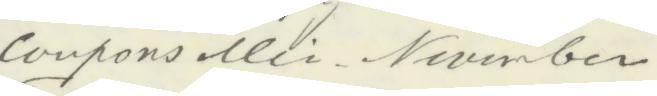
coupons Mei - November
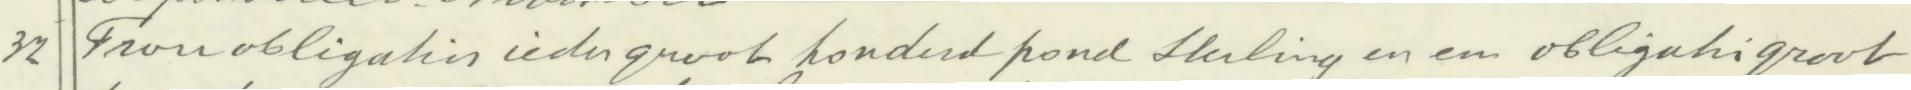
32 Twee obligaties ieder groot honderd pond Sterling en een obligatie groot
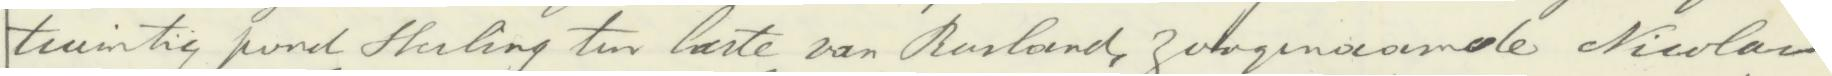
twintig pond Sterling ten laste van Rusland, Zoogenaamde Nicolai
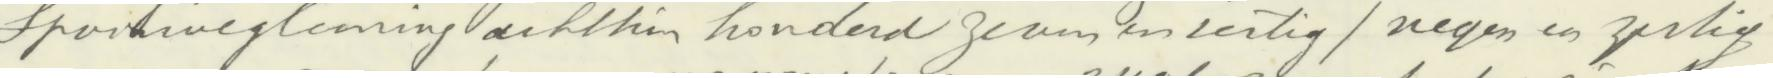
Spoorwegleening achttien honderd zeven en zestig / negen en zestig
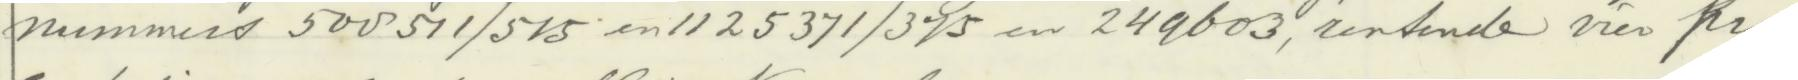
nummers 508511 / 515 en 1125371 / 375 en 249603, rentende vier pro
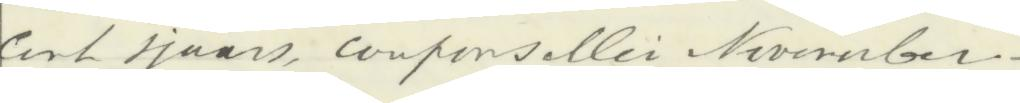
cent sjaars, coupons Mei November
